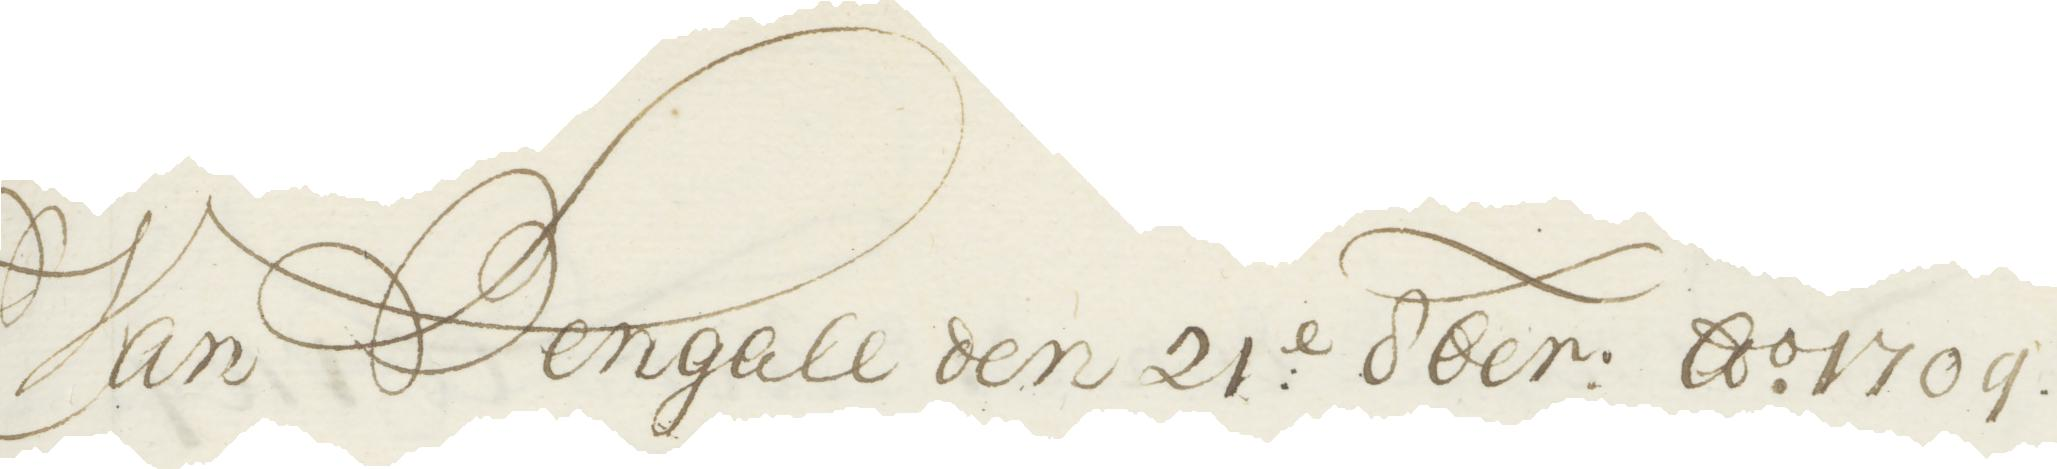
Van Bengale den 21:e 8ber: A.o 1704.
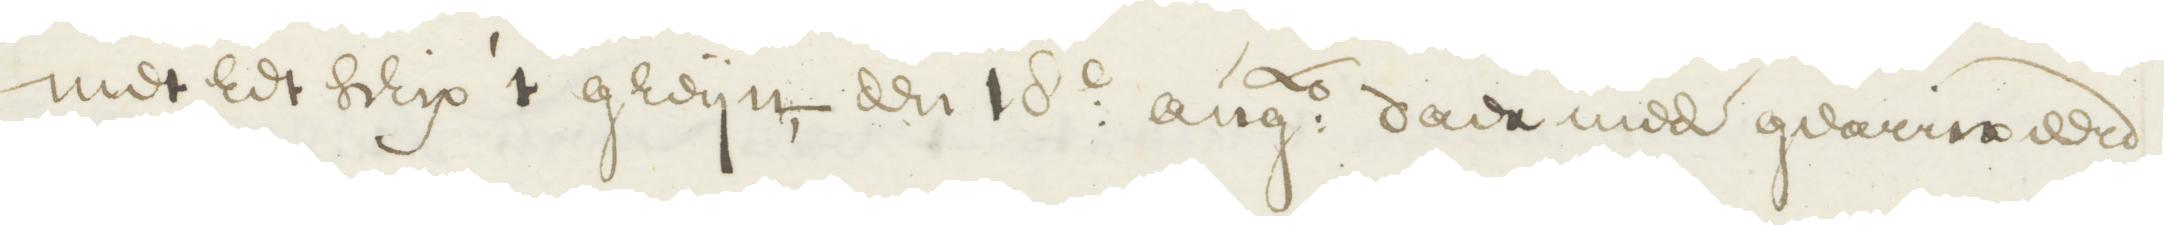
met het schip ’t gheijn, den 18:e aug:to daer mede gearriveerd
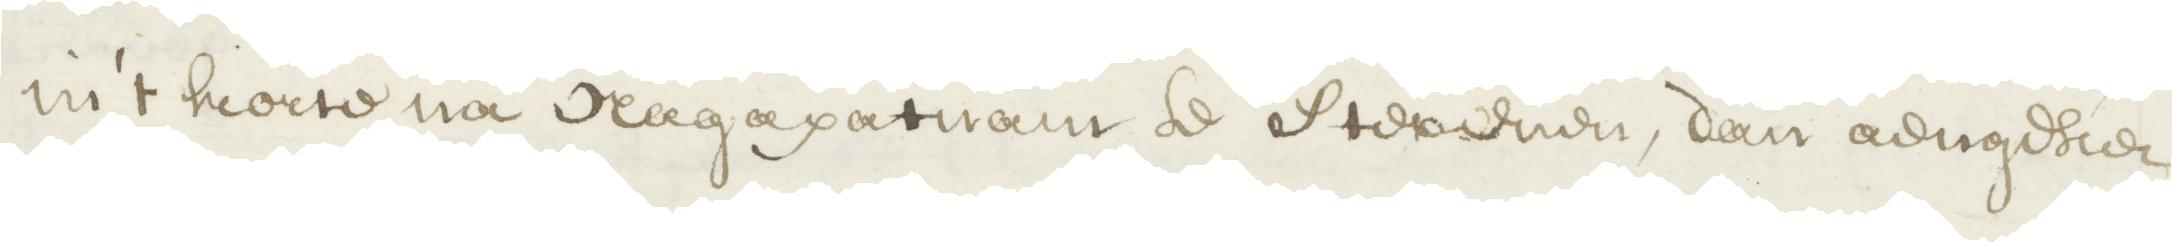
in ’t korte na Nagapatnam te stevenen, dan aengesien
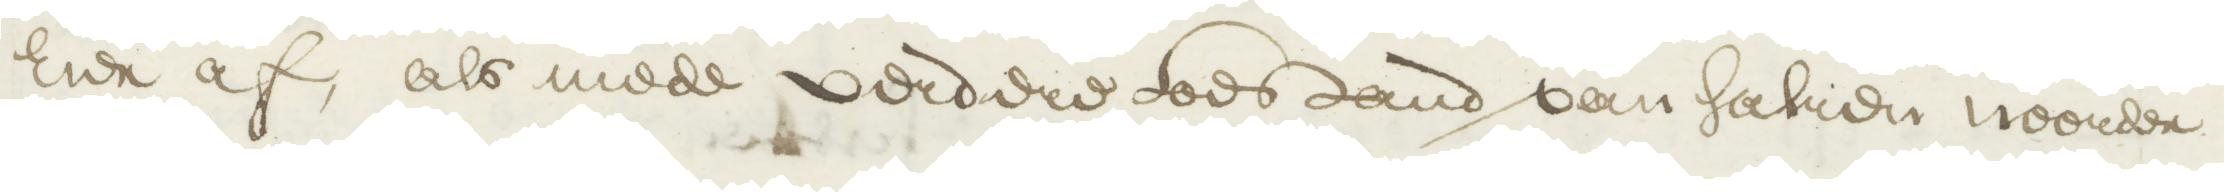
hier af, als mede verdere toestand van saken noorder
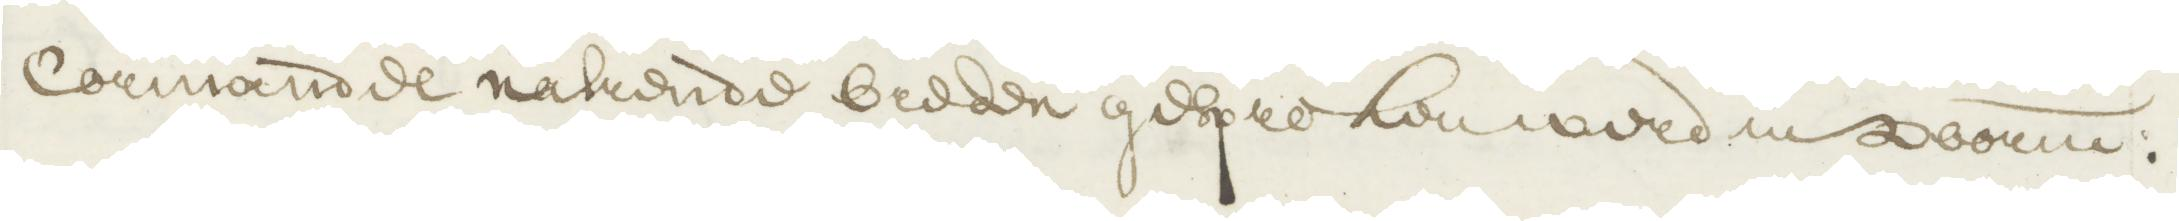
Cormandel rakende breden gesproken werd in voorm:
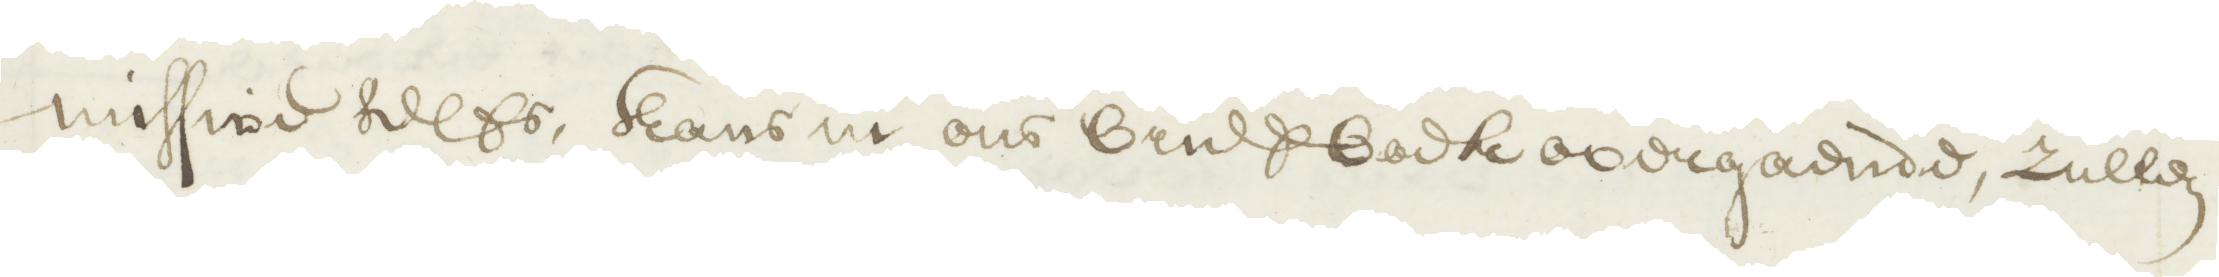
missive selfs, thans in ons briefboek overgaende, zullen
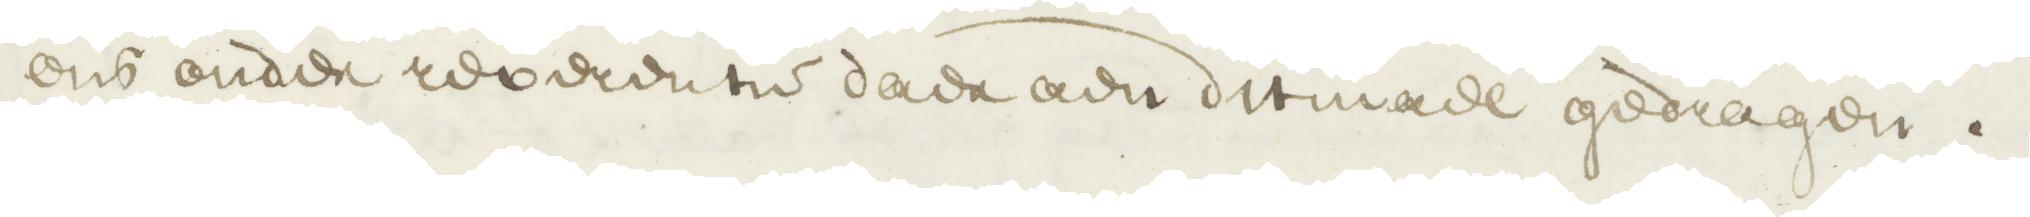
ons onder reverentie daer aen ditmael gedragen.
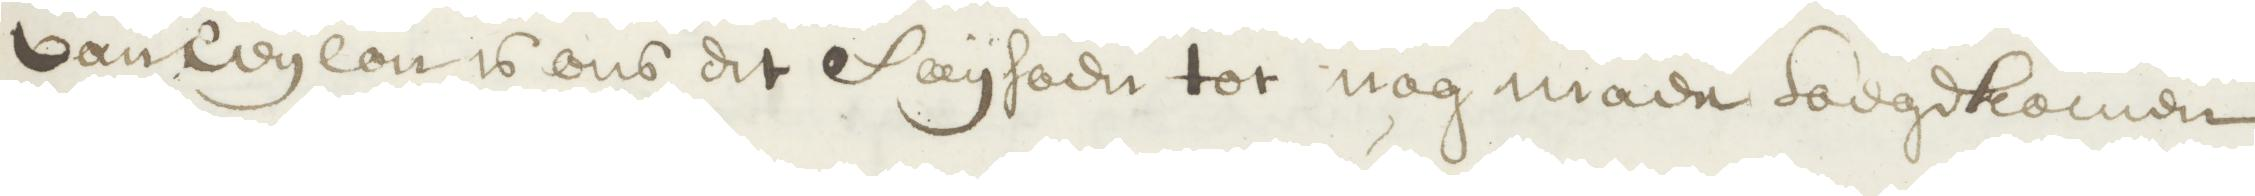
van Ceijlon is ons dit Saijsoen tot nog maer toegekomen
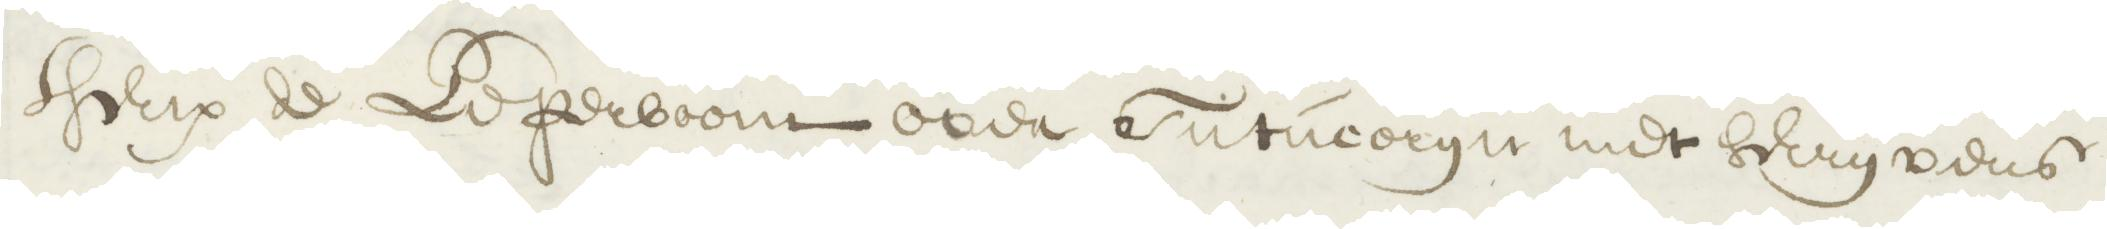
t schip de Peperboom, over Tutucorijn met schrijvens
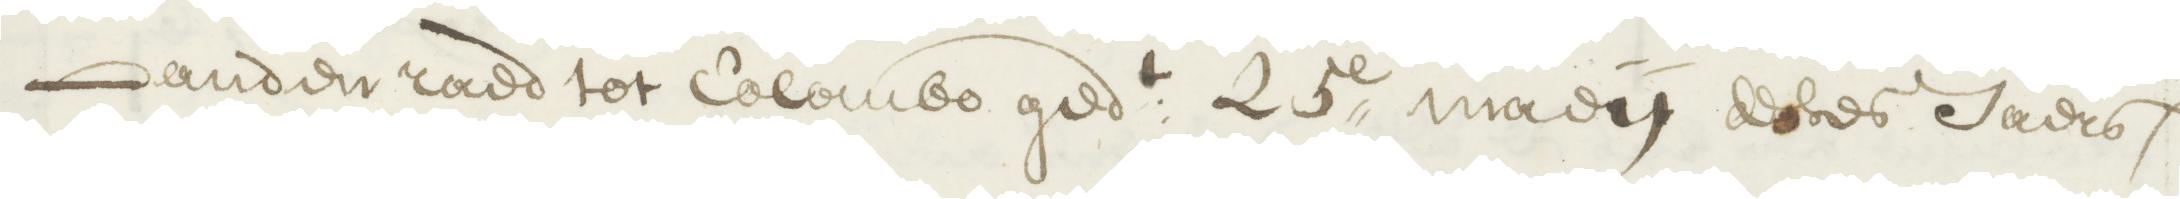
vanden raed tot Colombo ged:t 25„e maeij deses Iaers
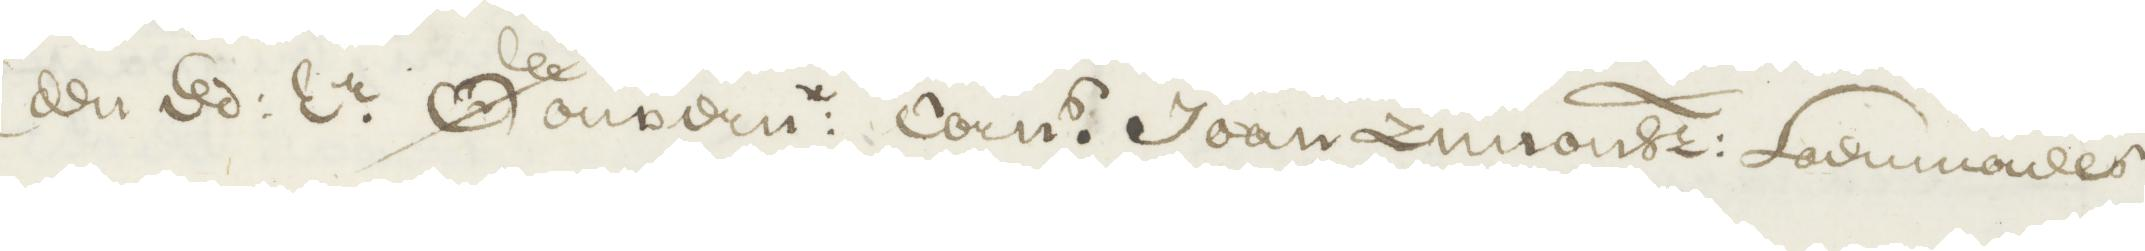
den Ed: h.r Gouvern:r Corn.s Ioan zimonsz: toenmaels
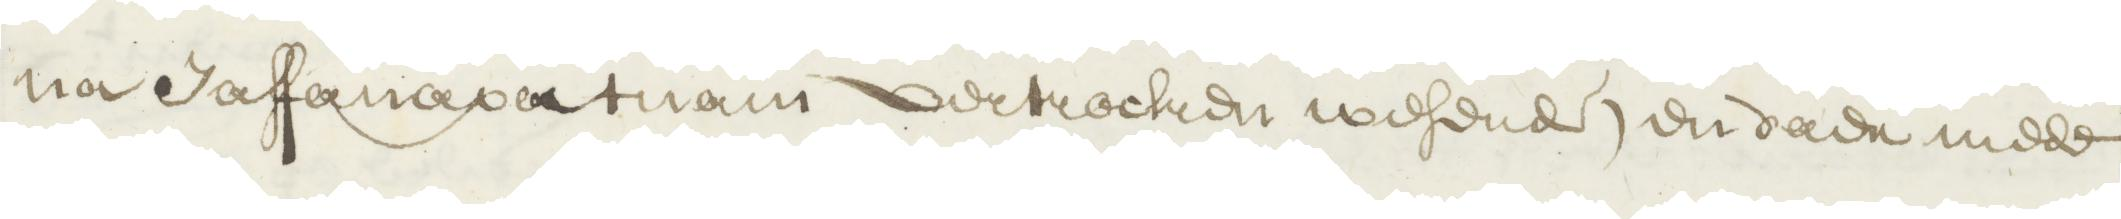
na Iaffanapatnam vertrocken wesende) en daer mede
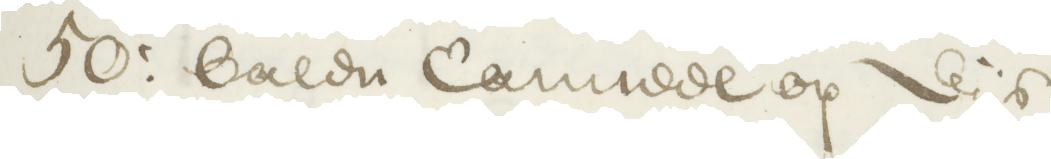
50: balen Canneel op Eijs
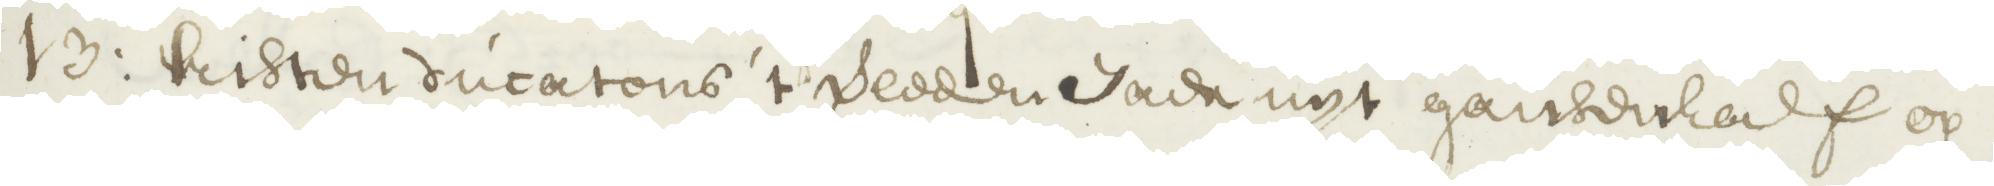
13: kisten ducatons 't verleden Iaer uijt gansen half op
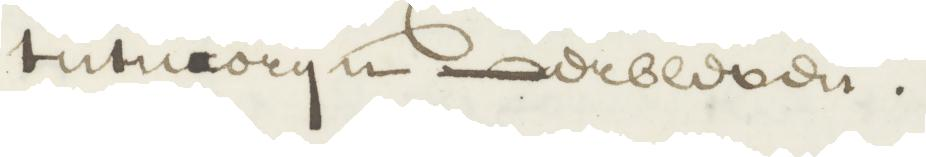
tutucorijn verbleven.
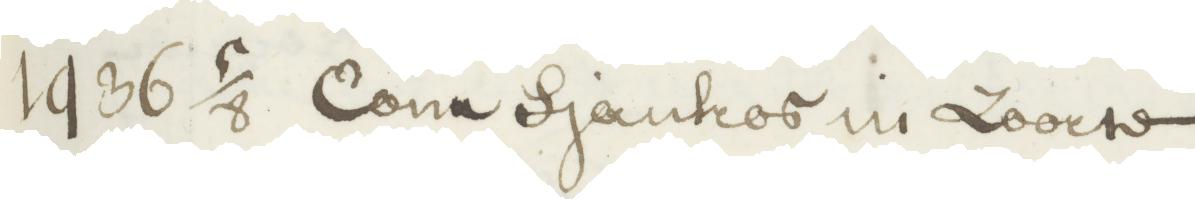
1436 5/8 Cóna sjankos in zoorte
